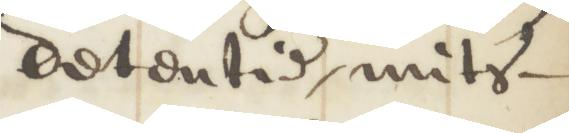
detentie mits-
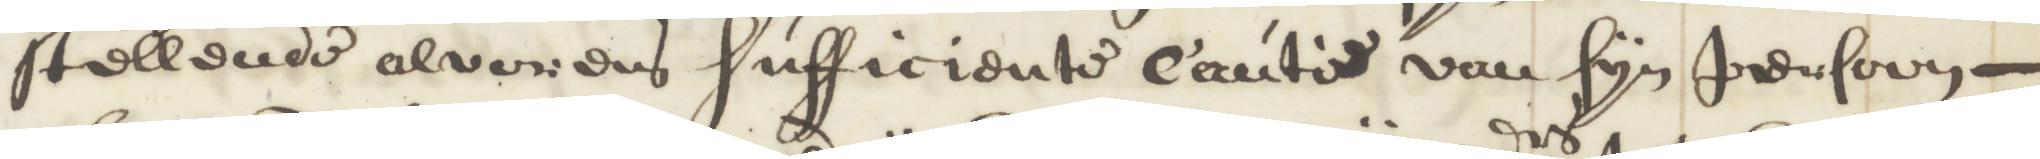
stellende alvorens sufficiente cautie van sijn persoon —
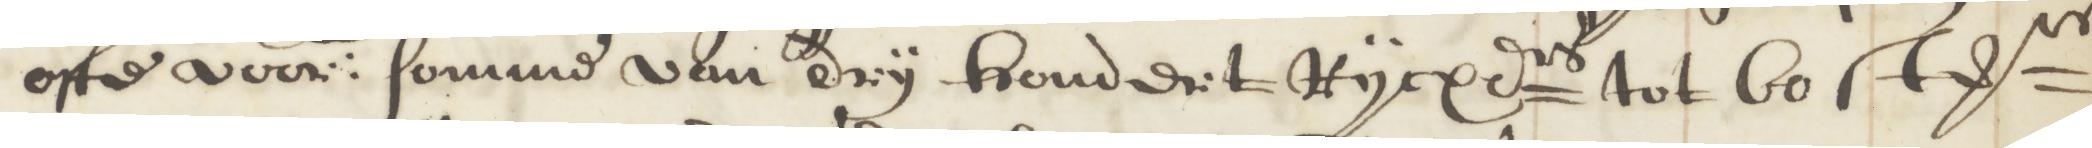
offe voor: somme van drij honder rijcxd=rs tot 60 stver=s
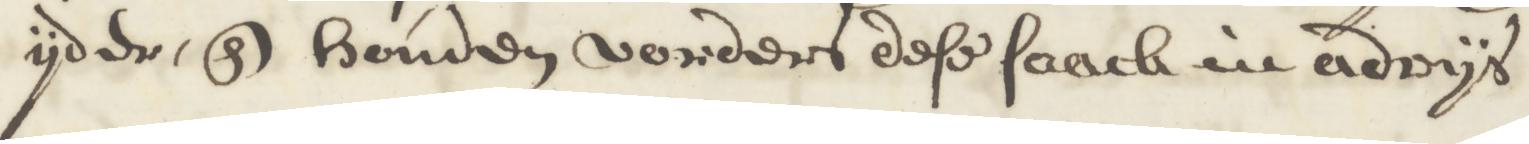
ijder, ende houden vorders dese saack in advijs
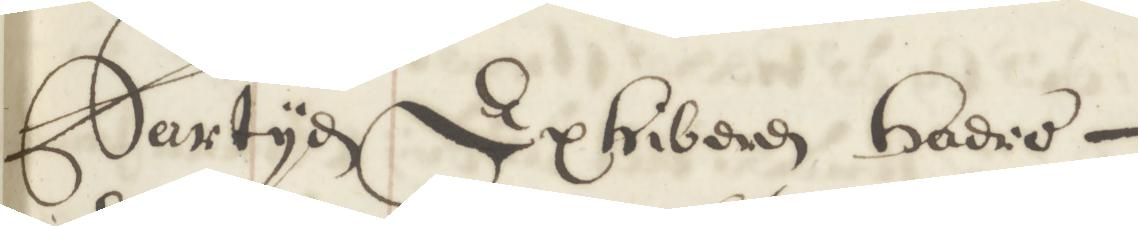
Partijen Exhiberen haere —
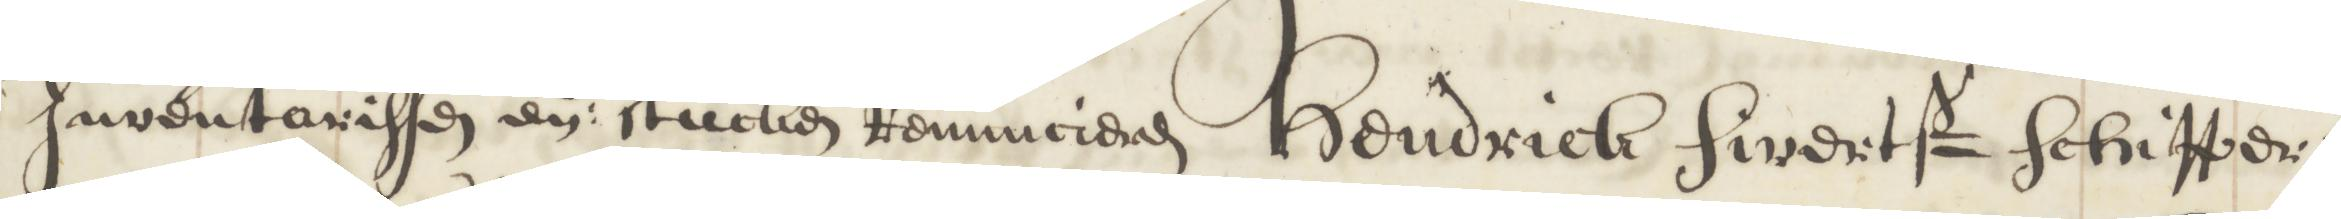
Jnventarissen en: stucken renuncieren Hendrick siverts= schipper
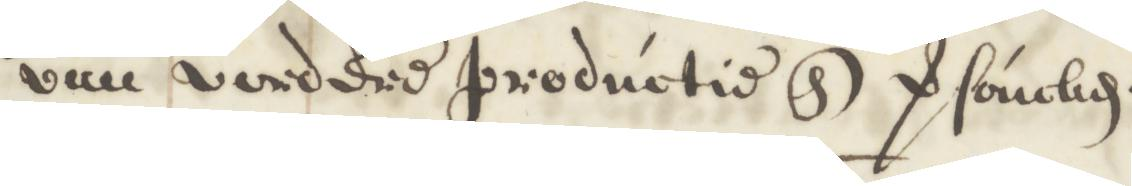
van verdere productie ende versoucken
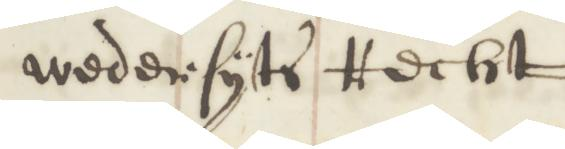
wedersijts recht
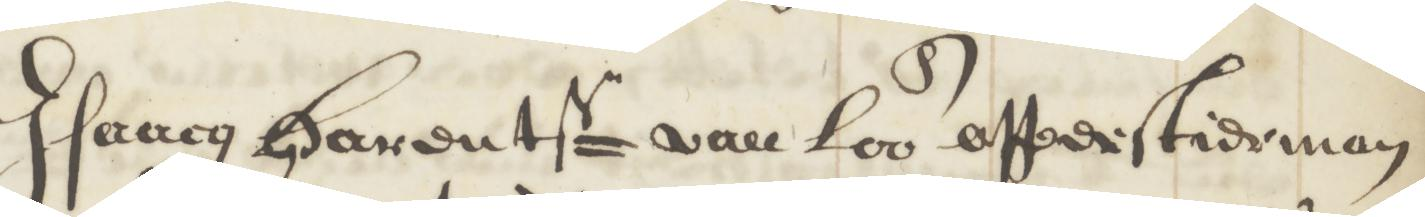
Jsaacq Barents=n van loo opperstierman
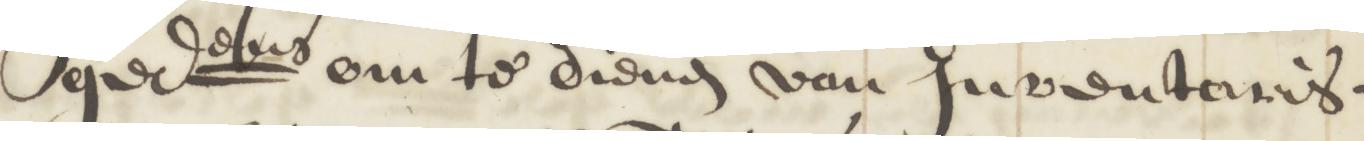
ged=ens om te dienen van Jnventaris
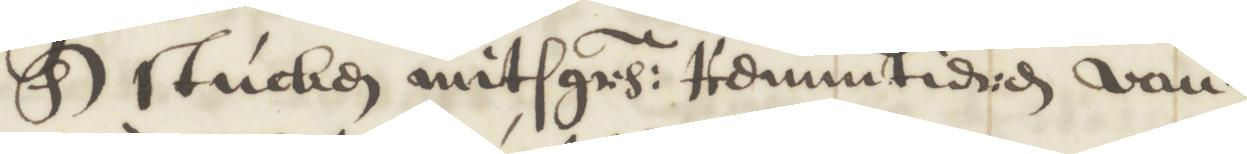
ende stucken mitsgrs: renuntieren van
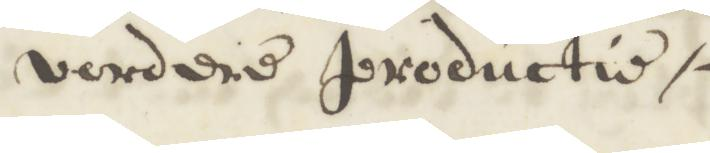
verdere productie/
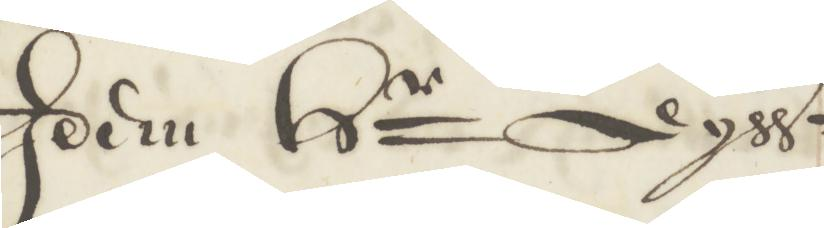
Jdem H=r Eyss=r
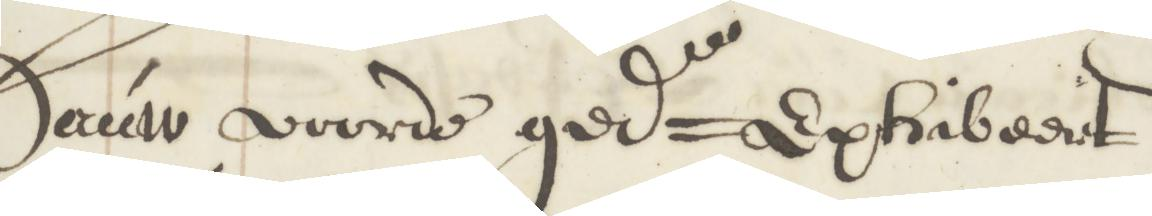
Pauw voorde ged=e Exhibeert
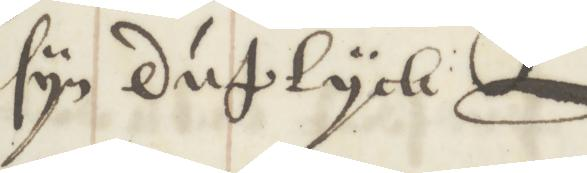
sijn duplijck —
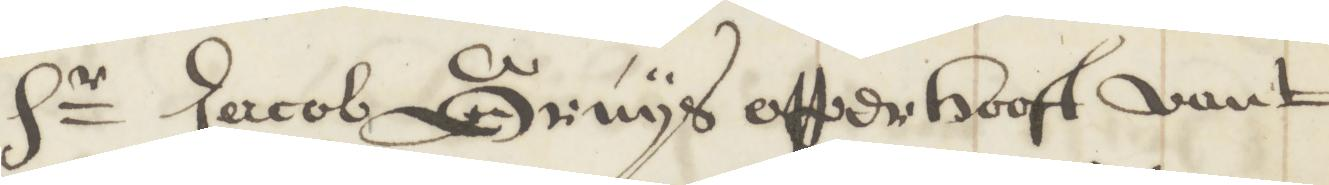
h=r Jacob Oruijs opperhooft van’t
